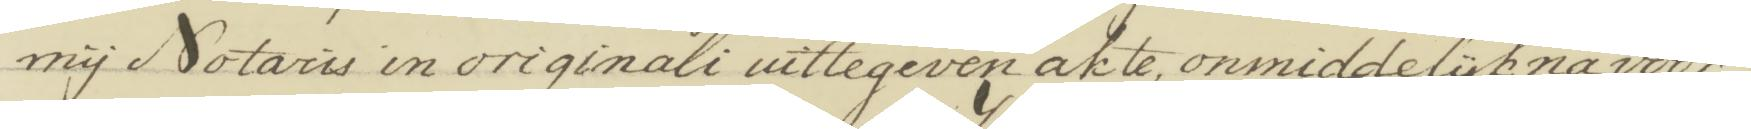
mij Notaris in originali uittegeven akte, onmiddelijk na voor
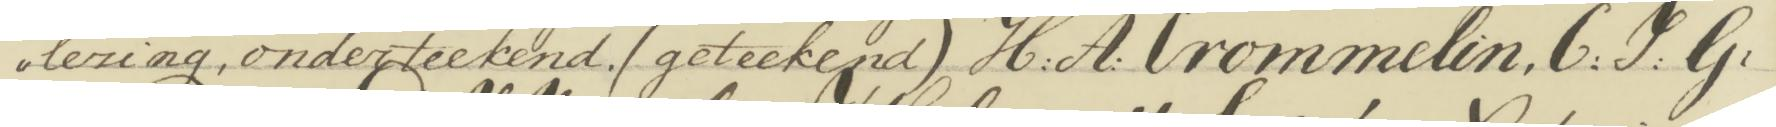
„lezing, onderteekend (geteekend) H: A: Crommelin, C: I: G:
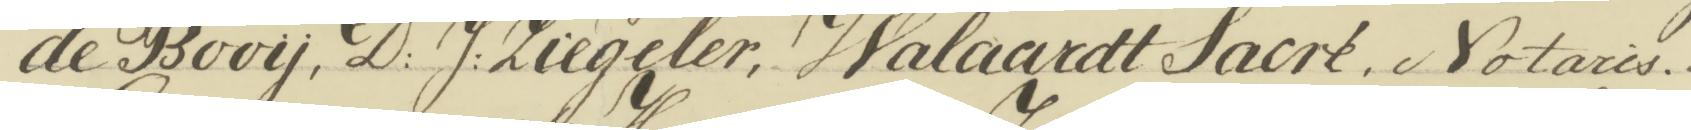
de Booij, D: J: Ziegeler, Walaardt Sacré, Notaris.
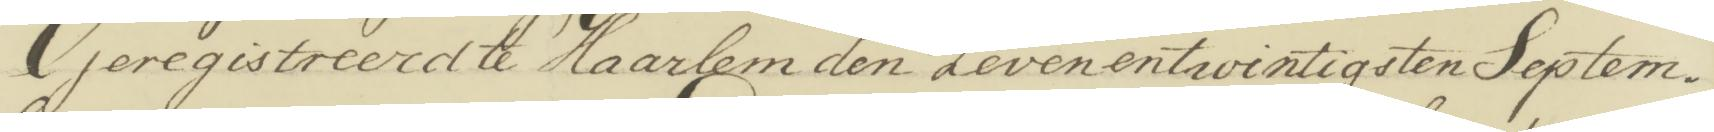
Geregistreerd te Haarlem den Zevenentwintigsten Septem„
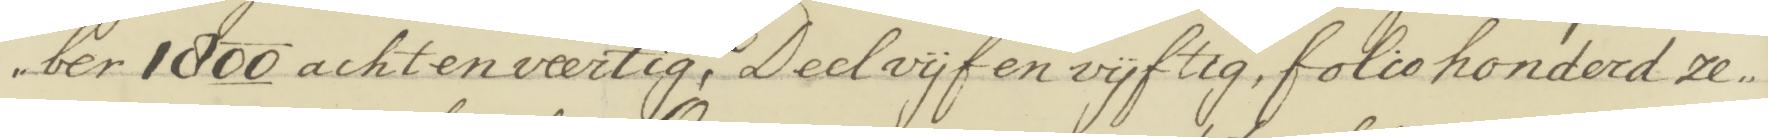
„ber 1800 acht en veertig, Deel vijf en vijftig, folio honderd ze„
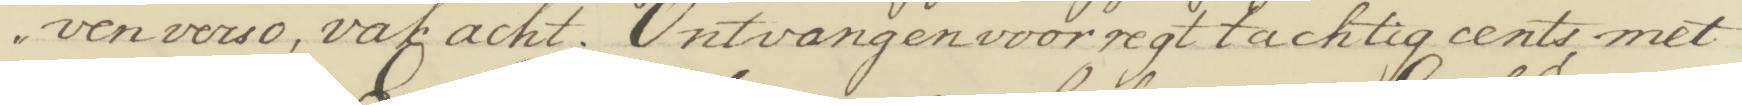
„ven verso, vak acht; Ontvangen voor regt tachtig cents met
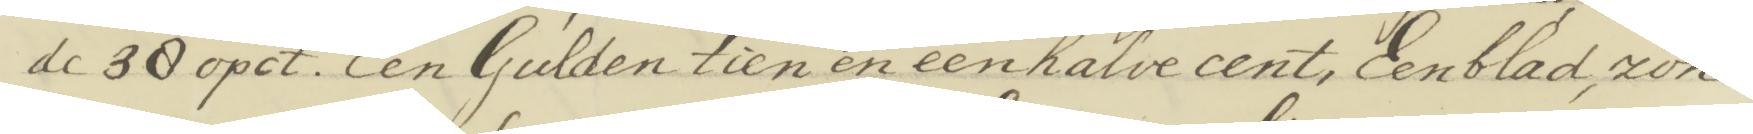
de 38 opct. Een Gulden tien en een halve cent, Een blad, zon
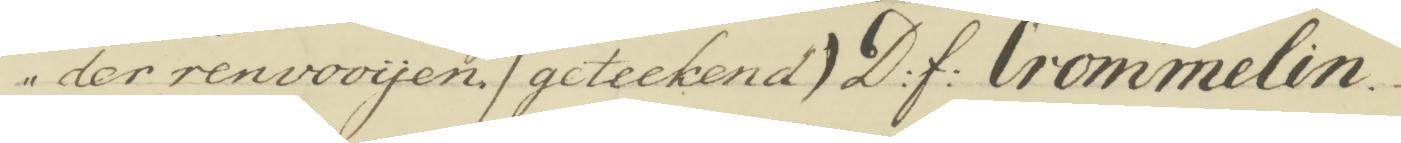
„der renvooijen. (geteekend) D:F: Crommelin.
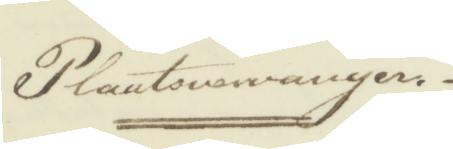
Plaatsvervanger. -
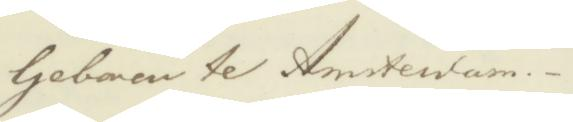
Geboren te Amsterdam. -
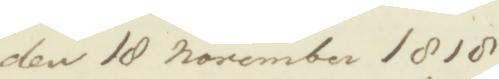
den 18 november 1818
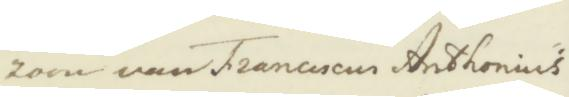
zoon van Franciscus Anthonius
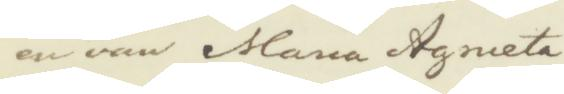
en van Maria Agnieta
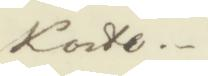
Korte. -
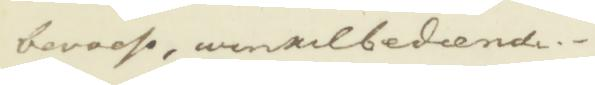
beroep, winkelbediende. -
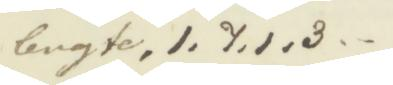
lengte, 1. 7. 1. 3. -
